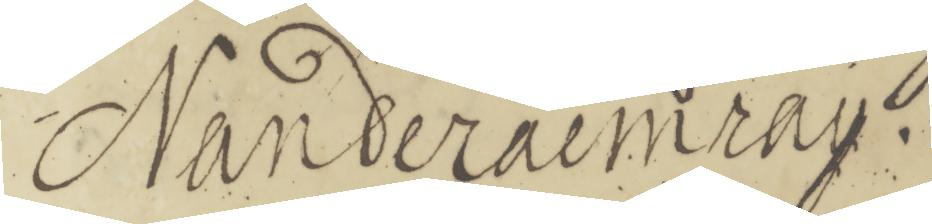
Nanderaem raij.
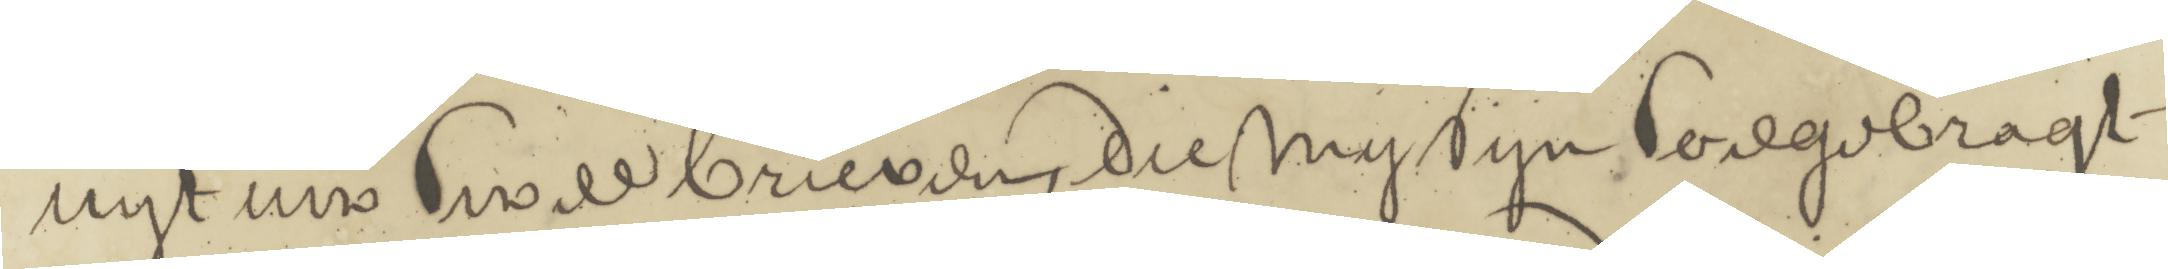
uijt uw twee brieven, die mij sijn toegebragt
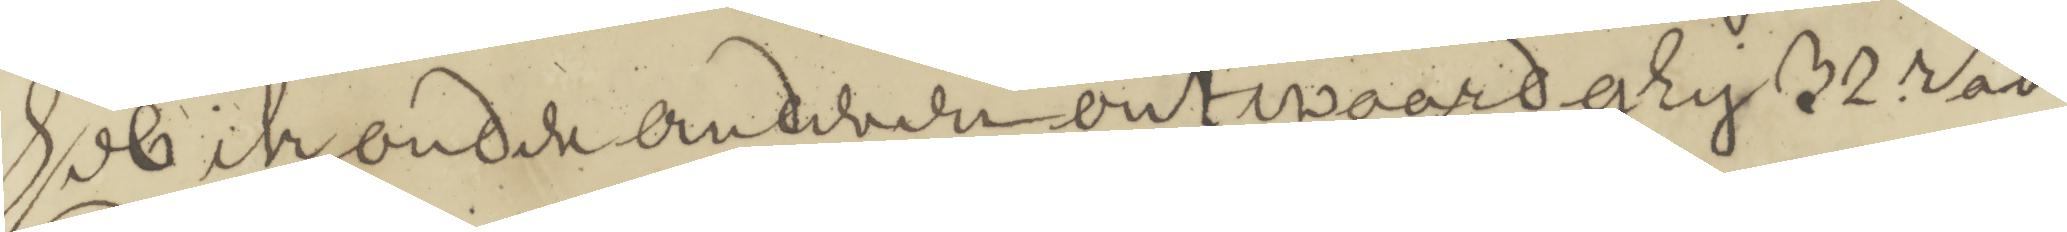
heb ik onder anderen ontwaard ghij 32. ro/as
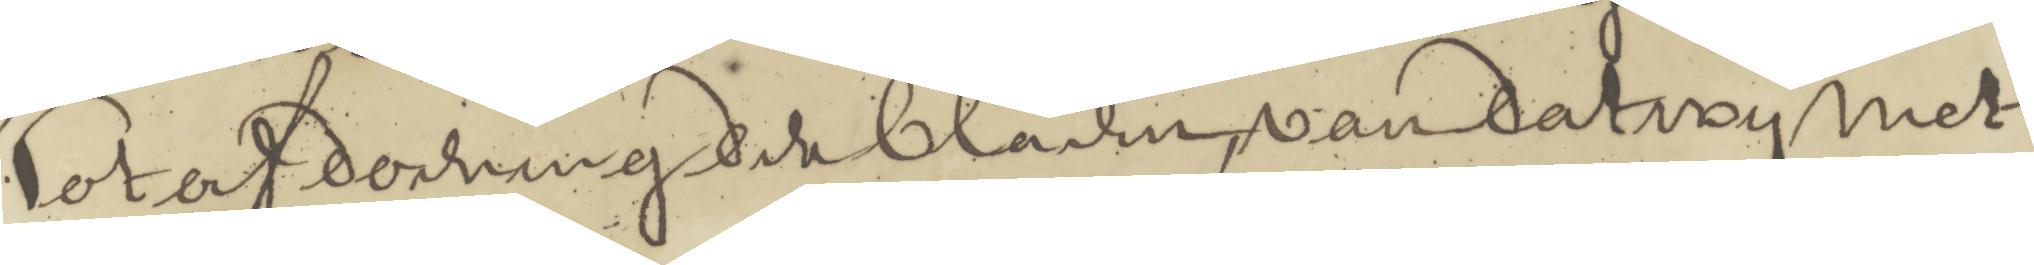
tot afdoening der blaem, van dat wij met
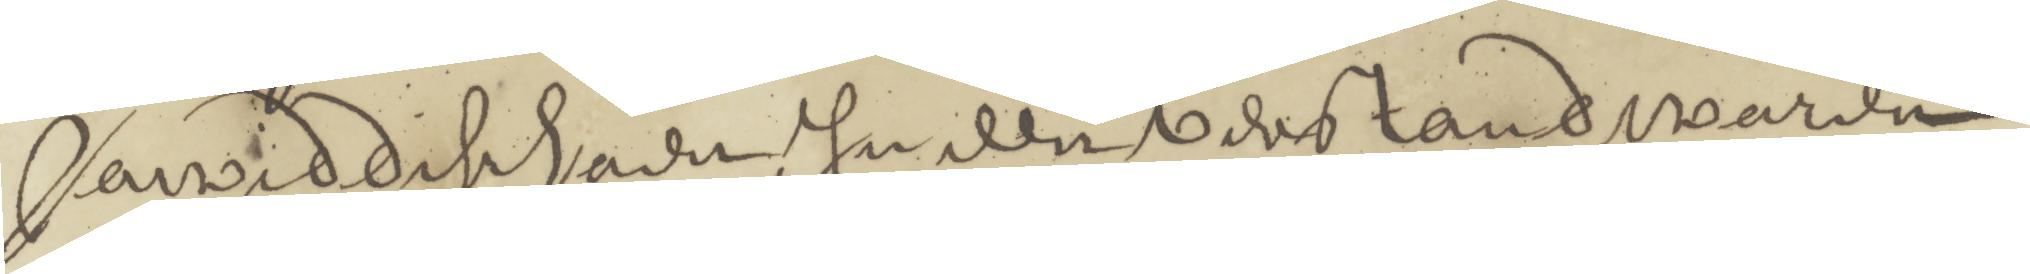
Jawiddikhaen, Jn een verstand waren
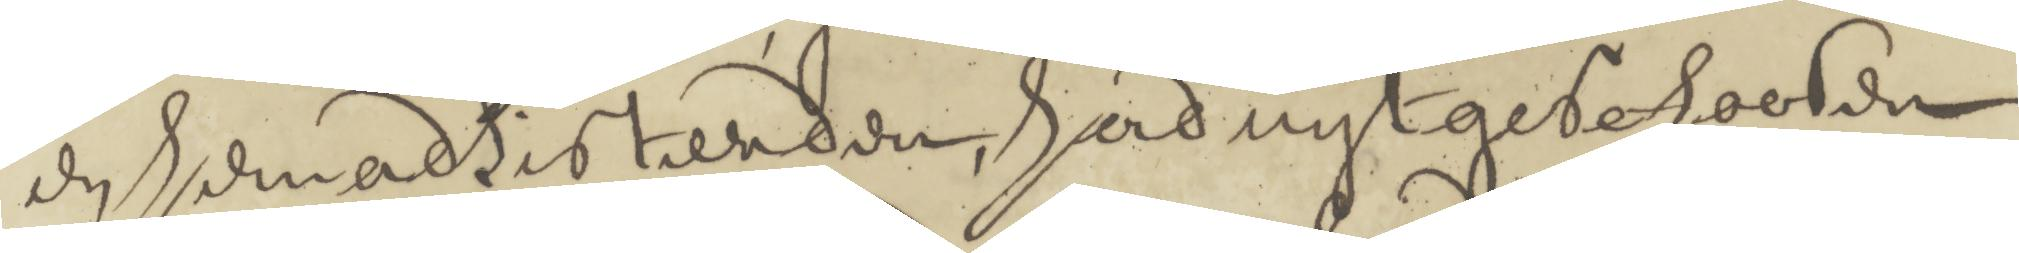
en hem adsisteerden, had uijtgeschooten
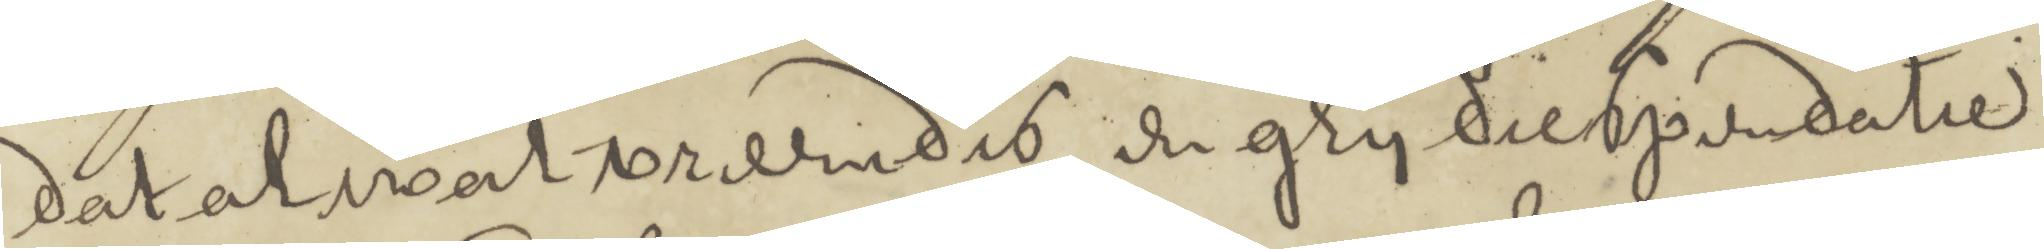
dat alwat vreemd is, en ghy diespendatie
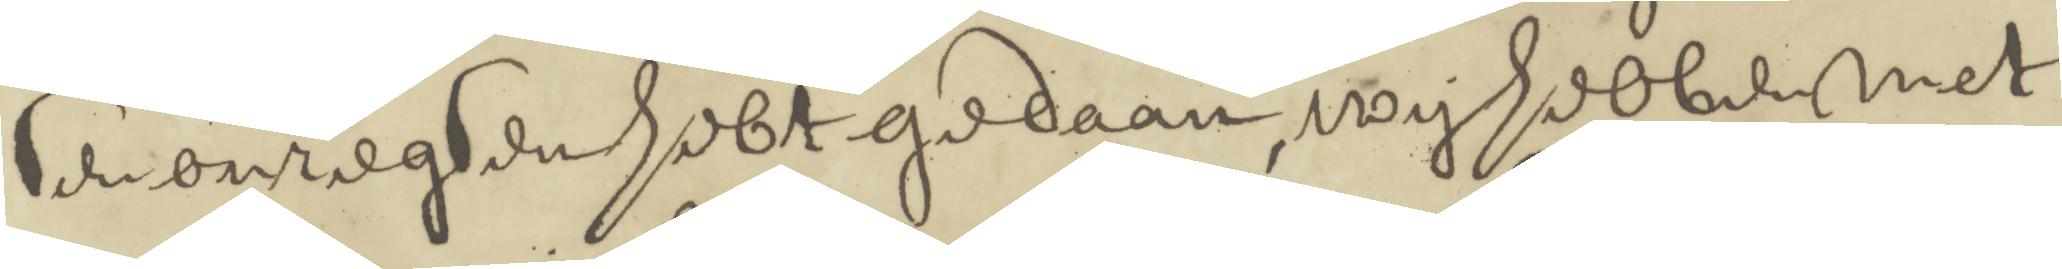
ten onregten hebt gedaan, wij hebben met
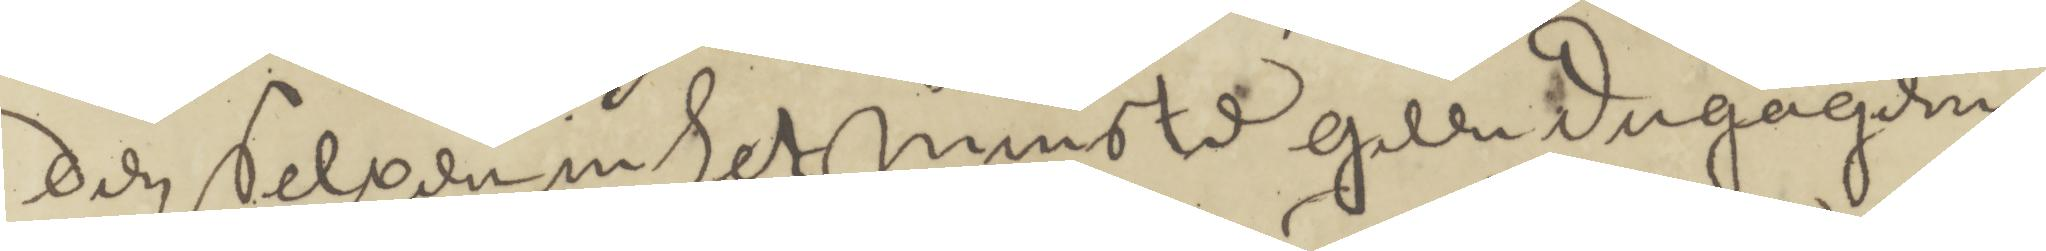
den selven in het minste geen Engagem.t
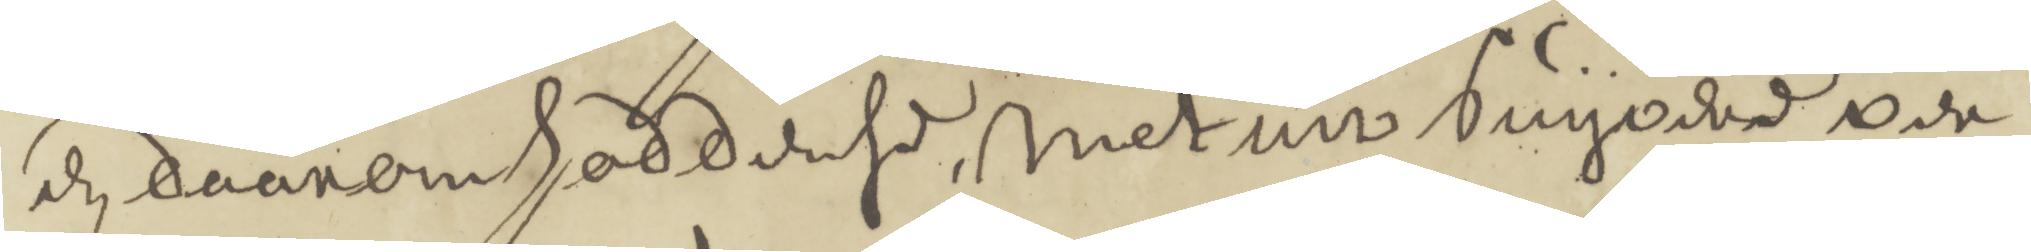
en daarom hadden se, met uw suijvere ver
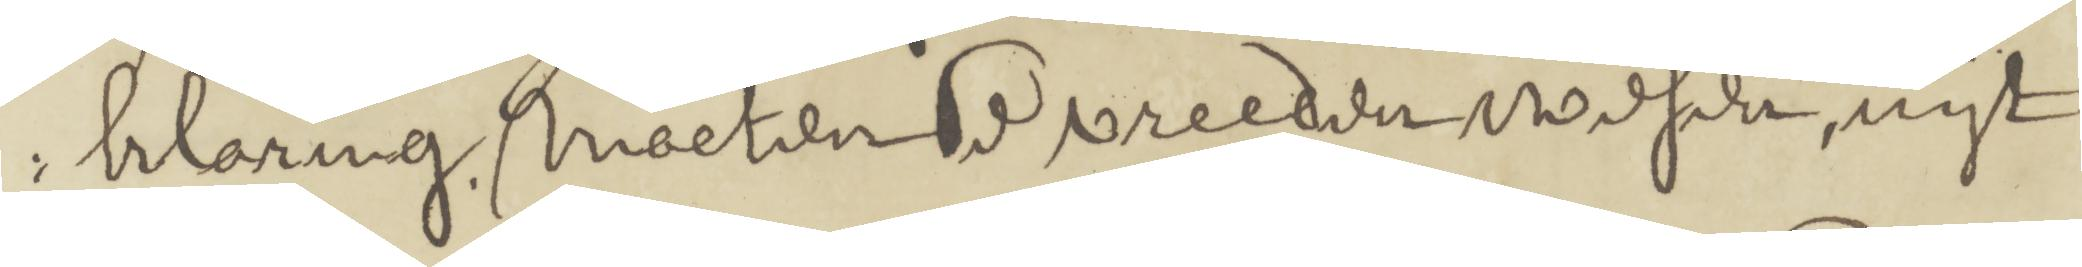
„klaring moeten te vreeden wesen, uijt
